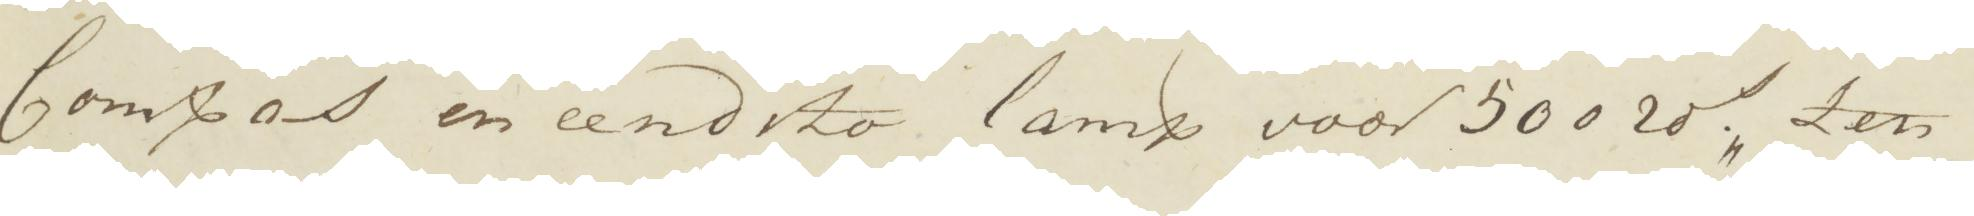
Compas en een dito lamp voor 500 rd.„s ten
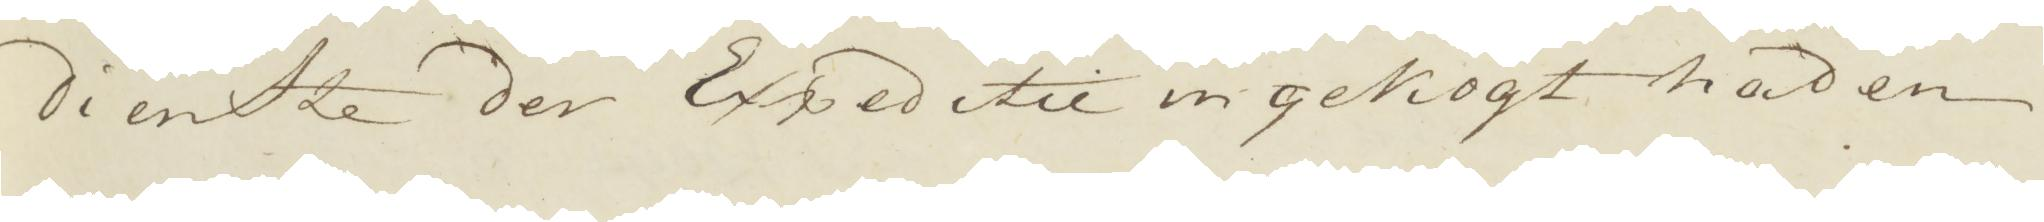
dienste der Expeditie ingekogt haden
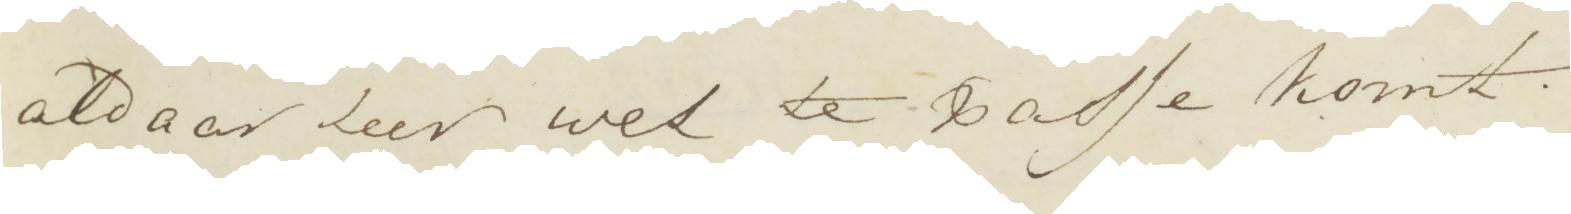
aldaar zeer wel te passe komt.
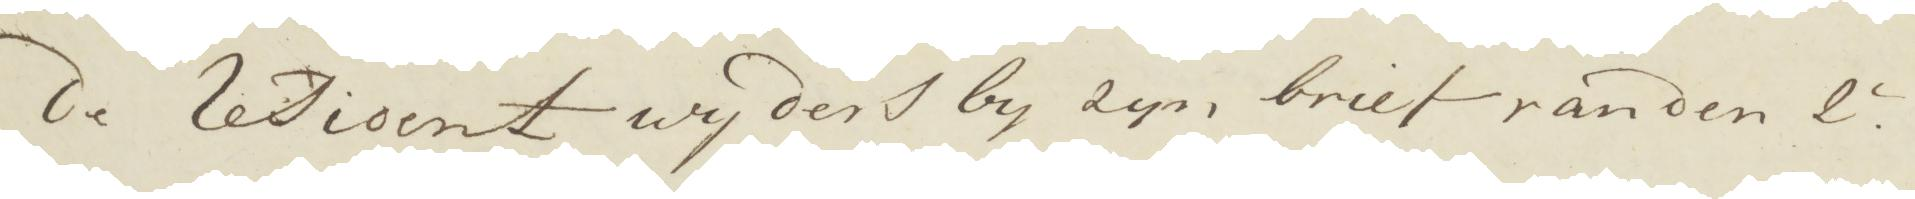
de resident wyders by zyn brief van den 2.'
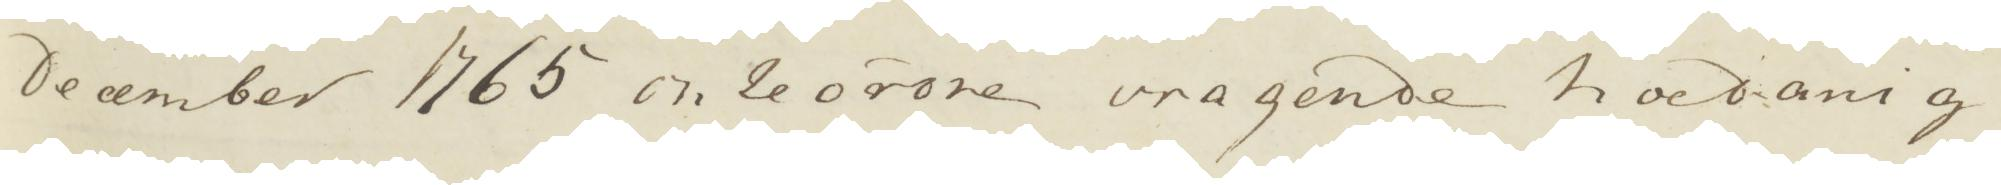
december 1765 onze ordre vragende hoedanig
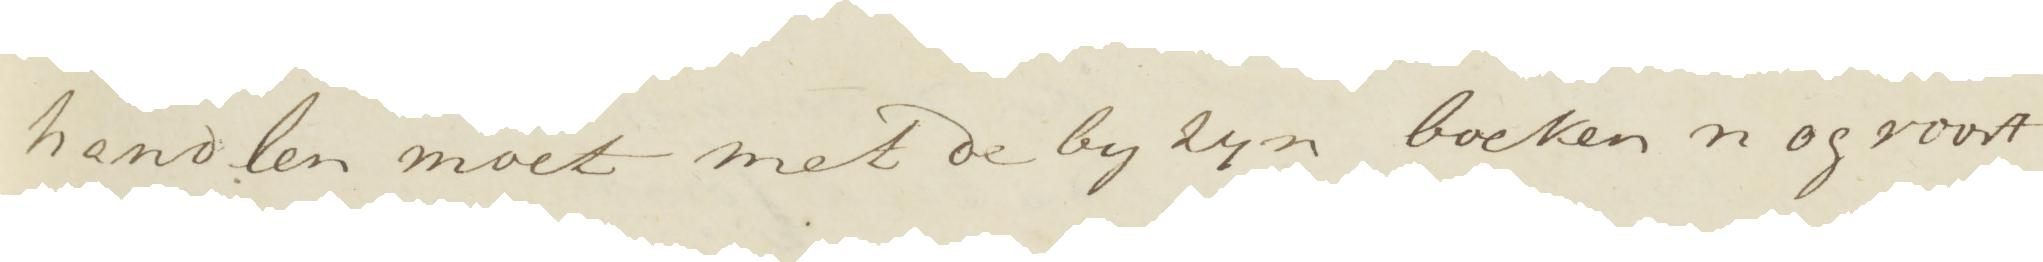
handlen moet met de by zyn boeken nog voort
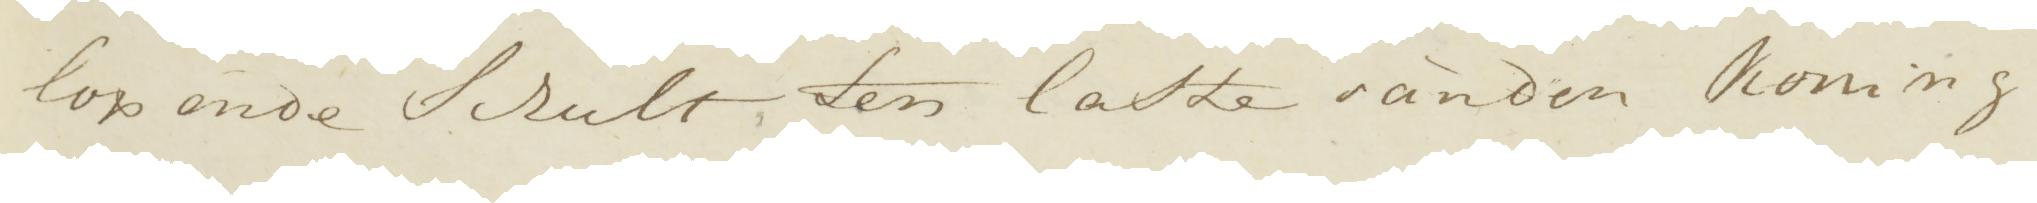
lopende schult, ten laste van den Koning
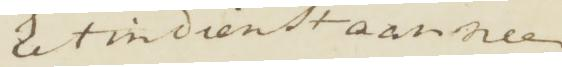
het in dienst aan nee
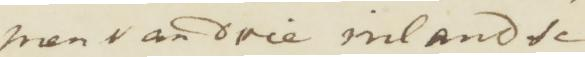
men van drie inlandse
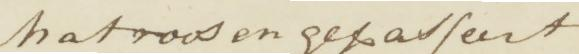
Matroosen gepasseert
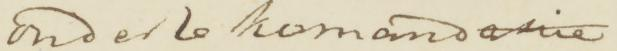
onder rekomandatie
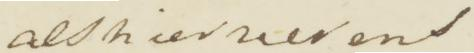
als hier neevens
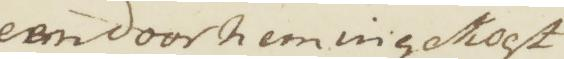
een door hem ingekogt
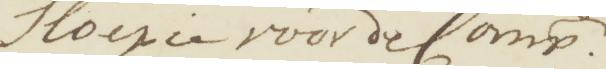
sloepie voor de Comp.e
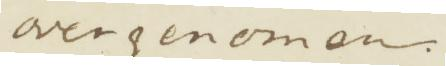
overgenomen.
